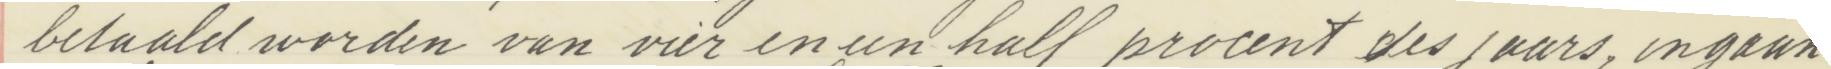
betaald worden van vier en een half procent des jaars, ingaan
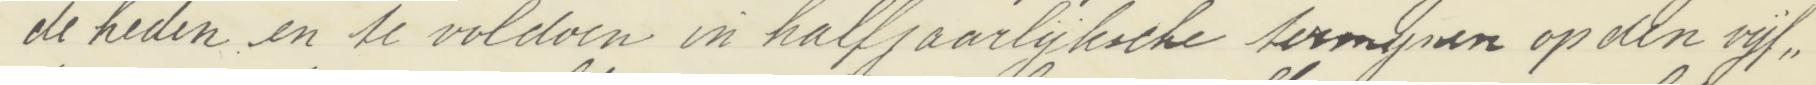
de heden en te voldoen in halfjaarlijksche termynen op den vijf„
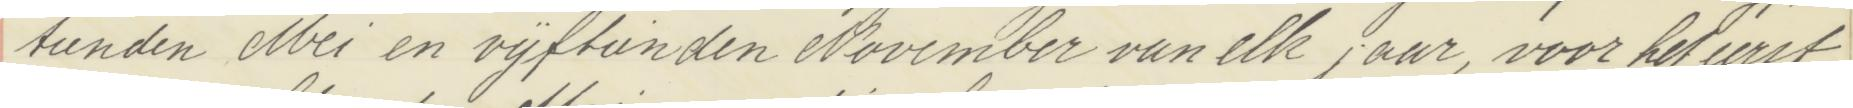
tienden Mei en vijftienden November van elk jaar, voor het eerst
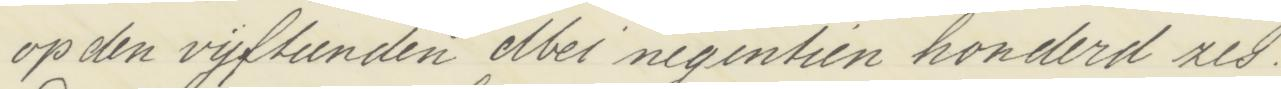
op den vijftienden Mei negentien honderd zes.
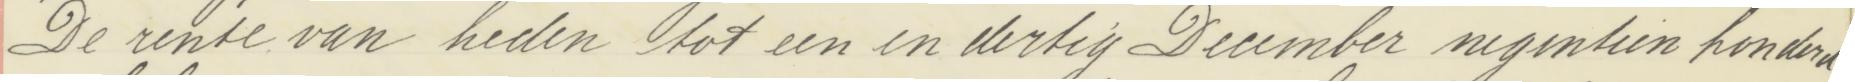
De rente van heden tot een en dertig December negentien honderd
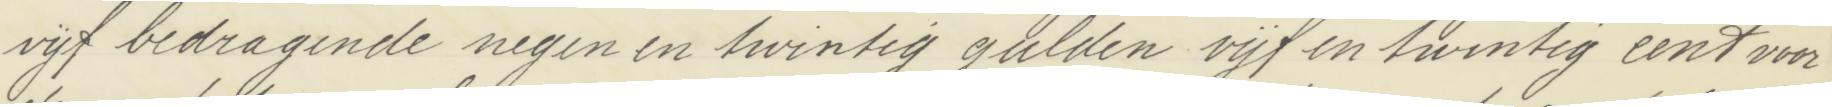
vijf bedragende negen en twintig gulden vijf en twintig cent voor
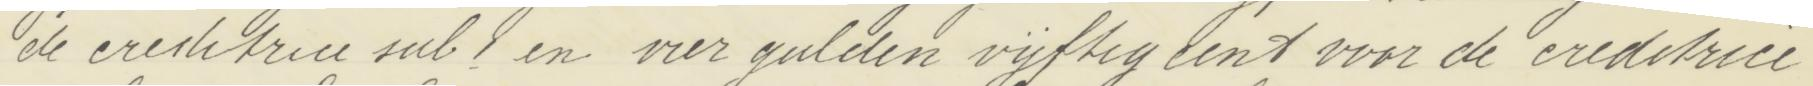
de creditrice sub 1 en vier gulden vijftig cent voor de creditrice
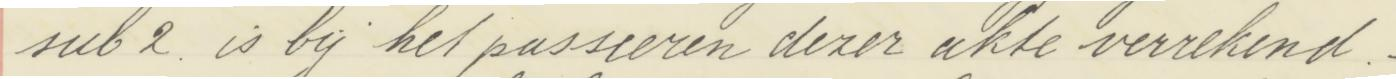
sub 2. is bij het passeeren dezer akte verrekend.
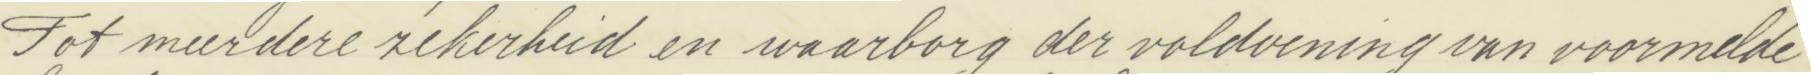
Tot meerdere zekerheid en waarborg der voldoening van voormelde
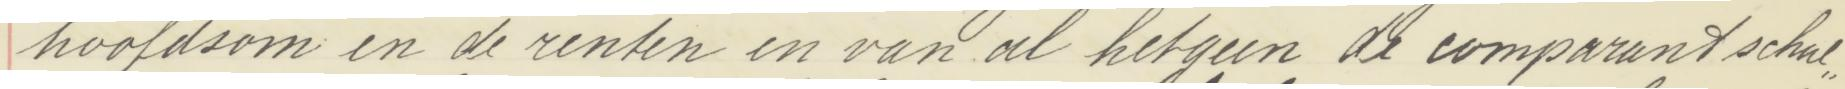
hoofdsom en de renten en van al hetgeen de comparant schul„
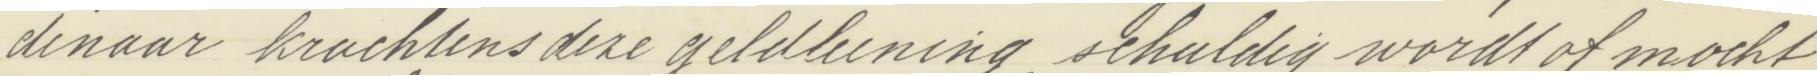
denaar krachtens deze geldleening schuldig wordt of mocht
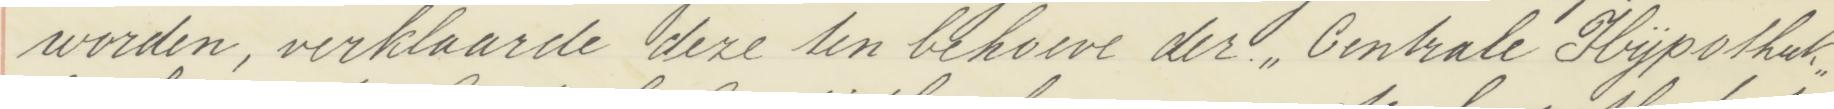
worden, verklaarde deze ten behoeve der „ Centrale Hijpotheek„
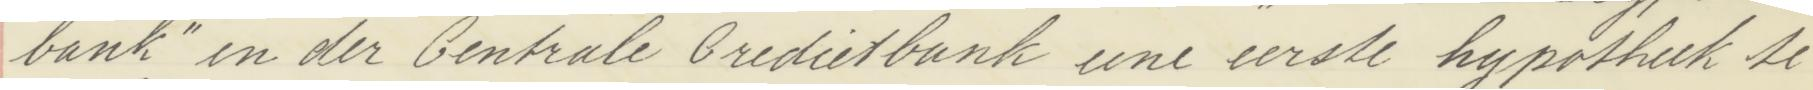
bank" en der Centrale Credietbank eene eerste hypotheek te
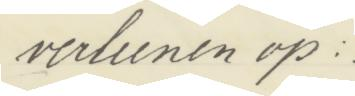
verleenen op:
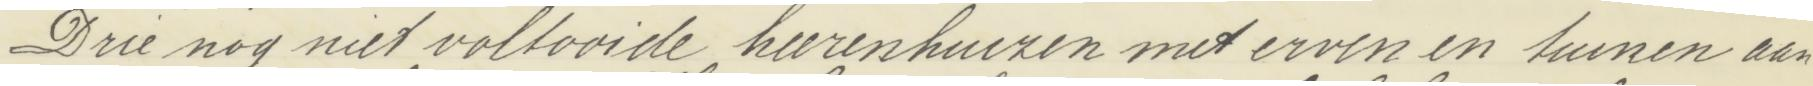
Drie nog niet voltooide heerenhuizen met erven en tuinen aan
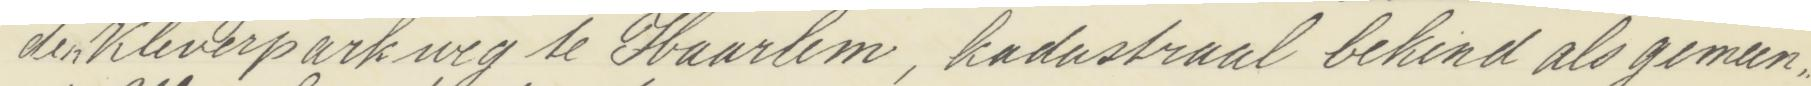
de Kleverpark weg te Haarlem, kadastraal bekend als gemeen„
